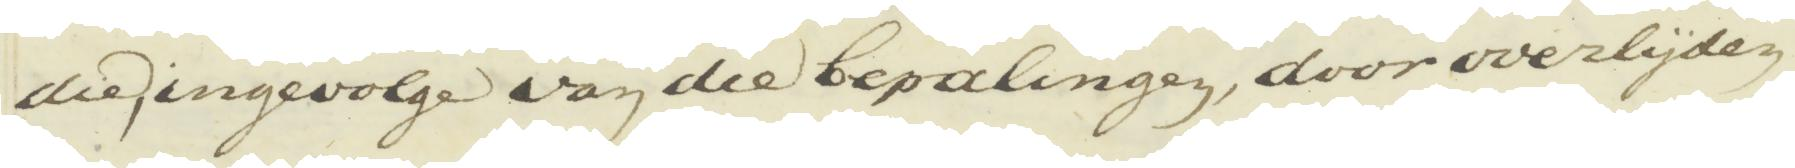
die, ingevolge van die bepalingen, door overlijden
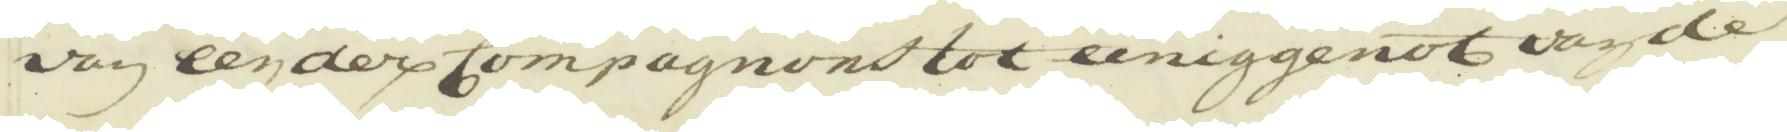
van een der Compagnons tot eenig genot van de
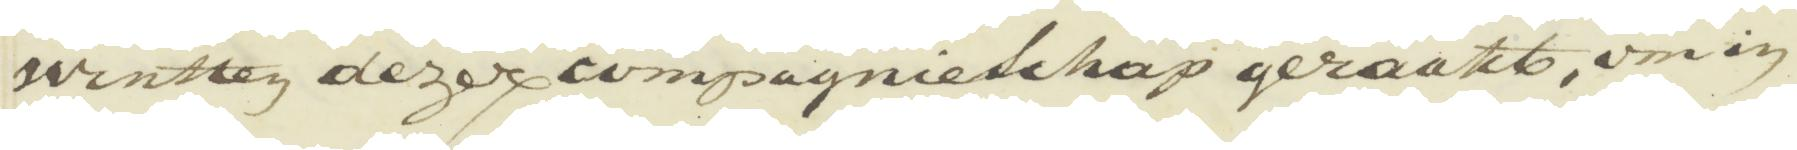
winsten dezer compagnieschap geraakt, om in
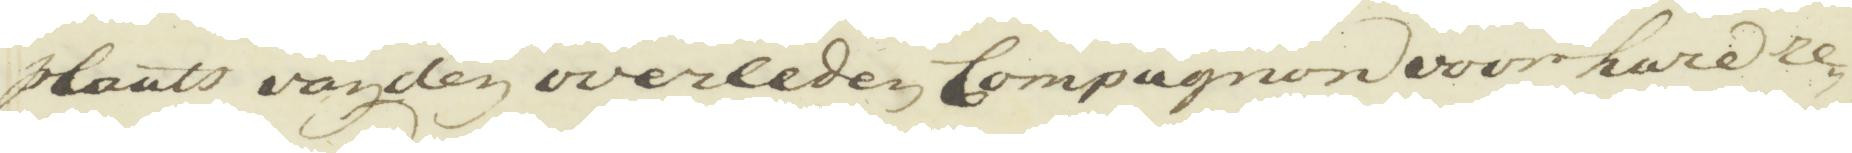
plaats van den overleden Compagnon voor hare re„
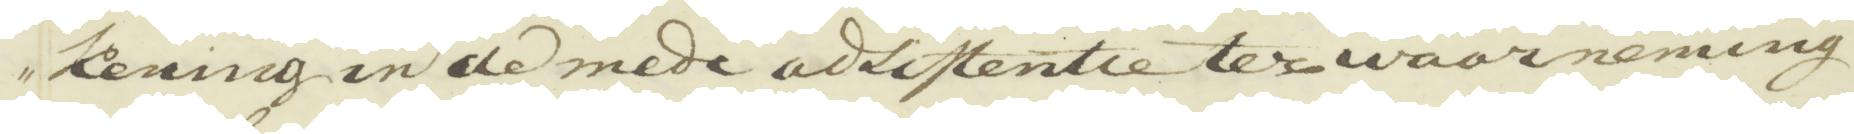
„kening in de mede adsistentie ter waarneming
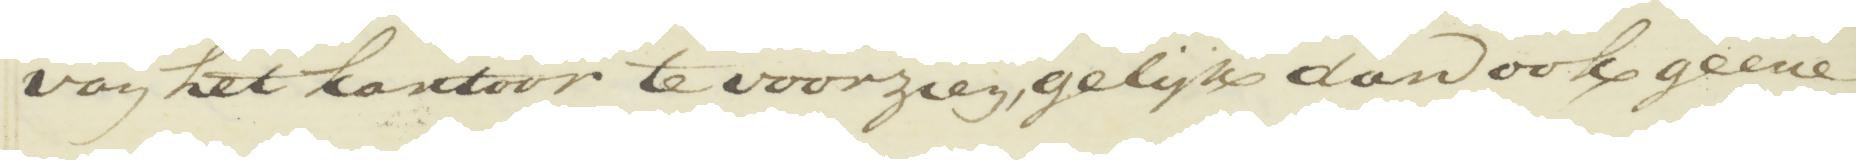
van het kantoor te voorzien, gelijk dan ook geene
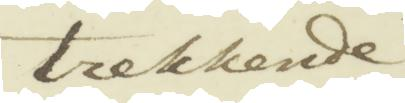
trekkende
